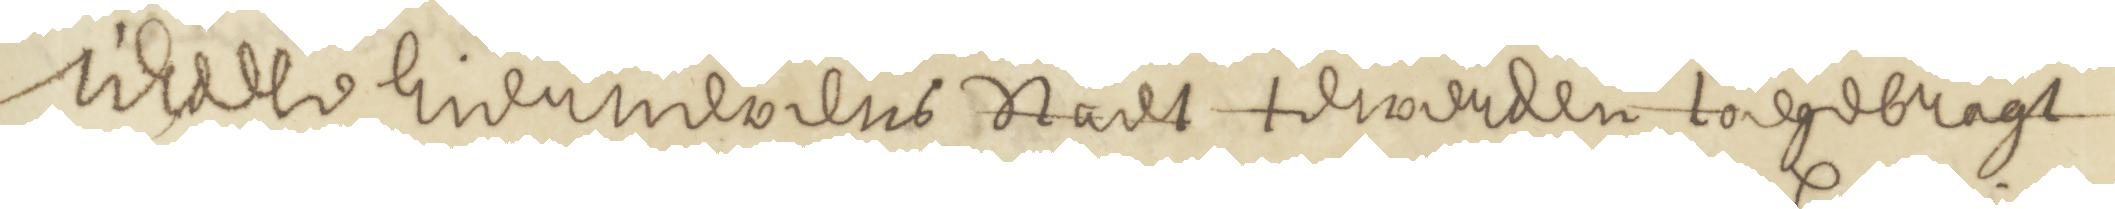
uEdele hiernevens staet te werden toegebragt
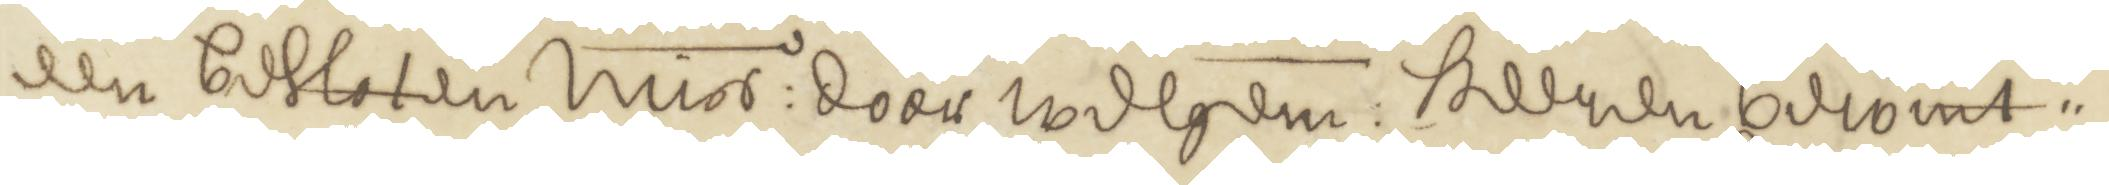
een besloten miss: door welgem: Heeren bewint„
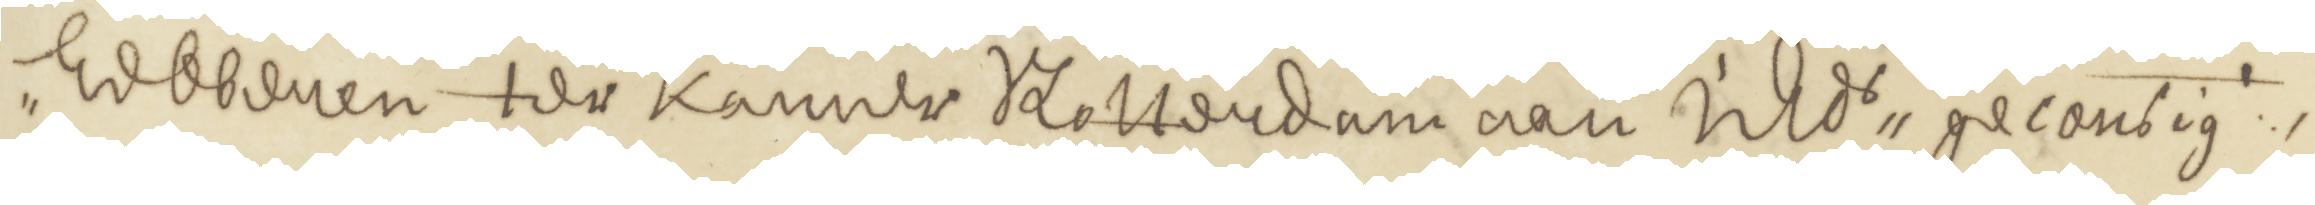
„hebberen ter kamer Rotterdam aan UEd„s geconsig:t,
